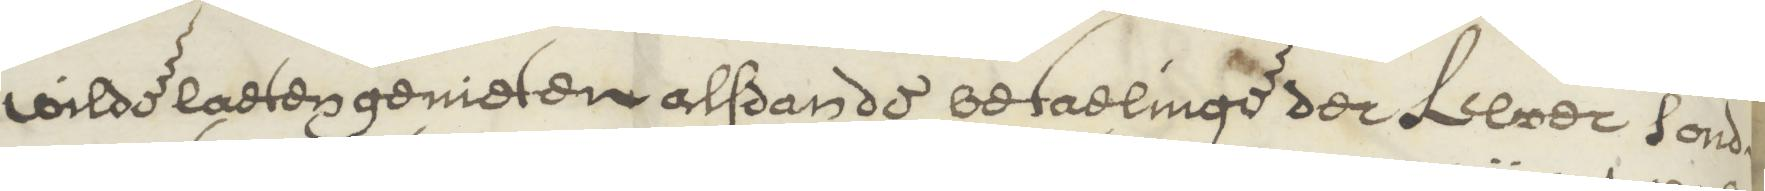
wilde laeten genieten alsdan de betaelinge der selver soud
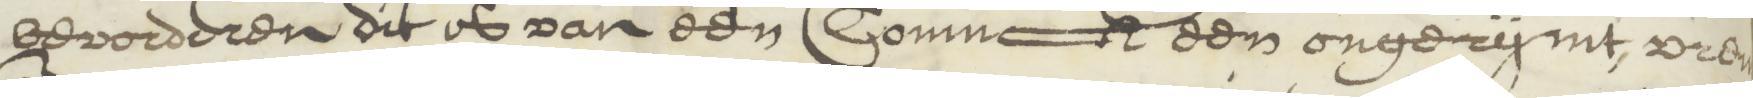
bevorderen dit is van een Coninc een ongerijmt, vre
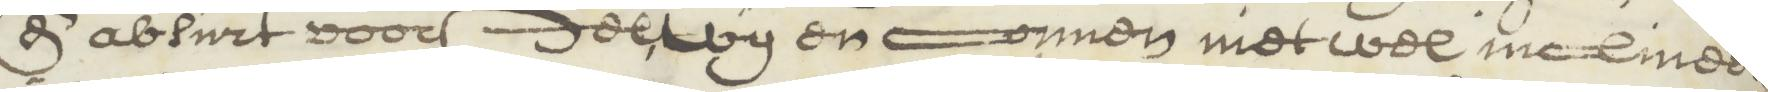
ende absurt voorstel wij en connen niet wel inclinee
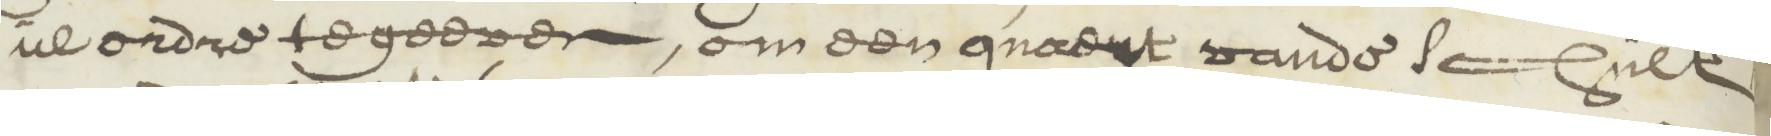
ul ordre te geeven, om een quaert vande schult
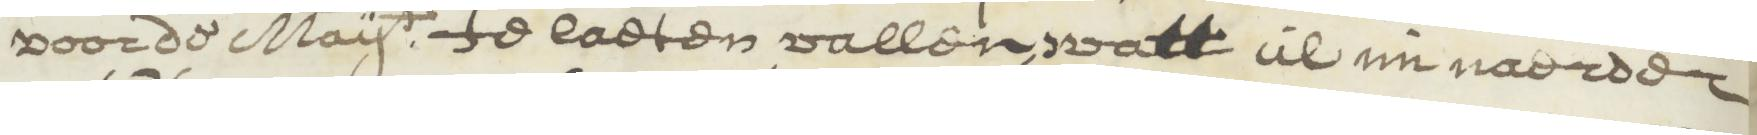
voor de Maij:t te laeten vallen, watt ue nu naerder
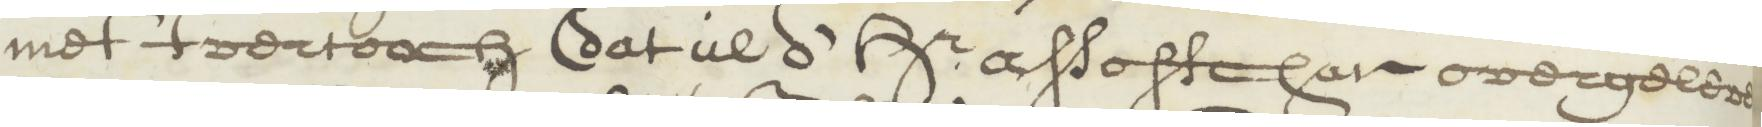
met ’t vertooch dat ue d’ Hr assoffchan overgelev
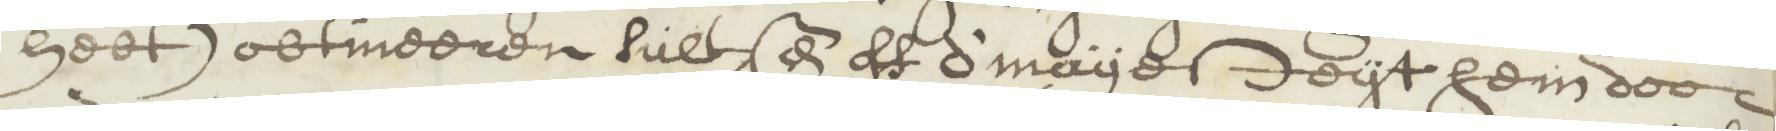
heet) obtineeren sult ende off d’maijesteijt hem door
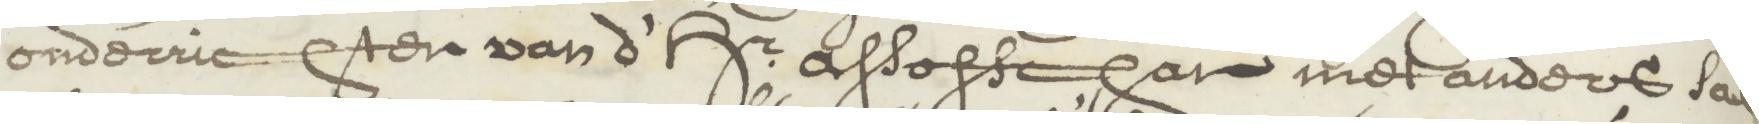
onderrichten van d’H.r assoffchan niet anders sal
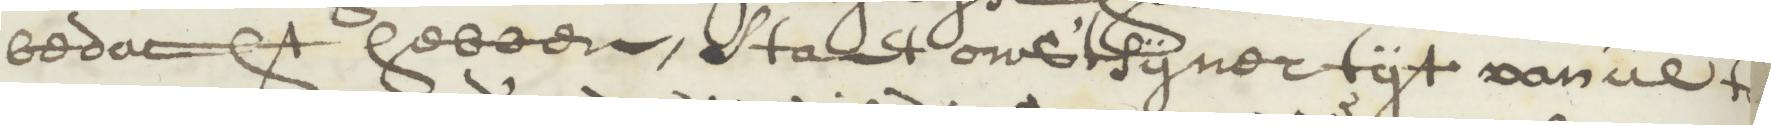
bedacht hebben, staet ons 'tsijner tijt van ue t
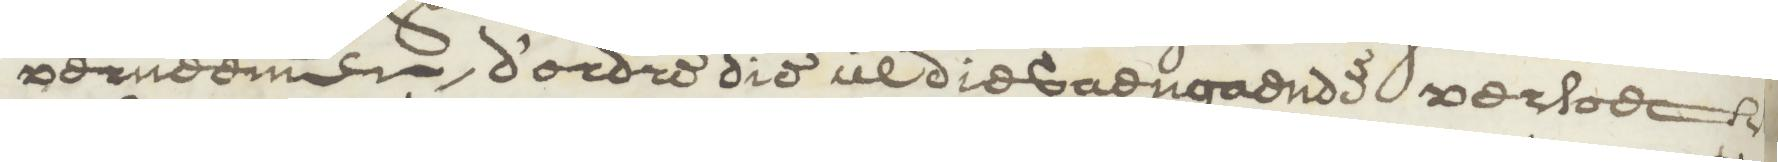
verneemen, d’ordre die ul diesaengaende versoeck
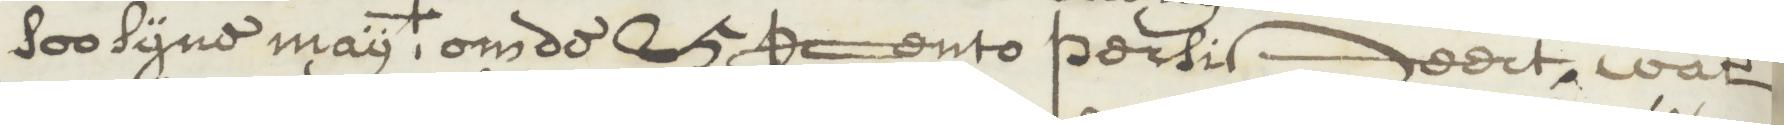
soo sijne maij,t omde 25 pcento persiseert, wat
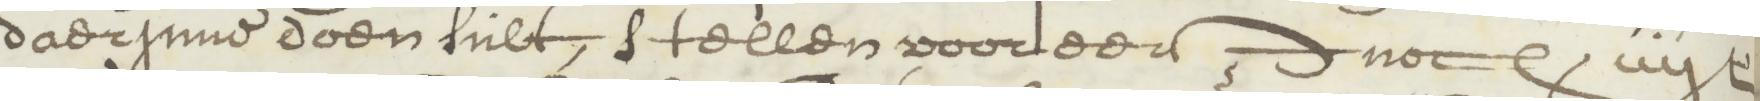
daerjnne doen sult, stellen vooreerst noch uijt
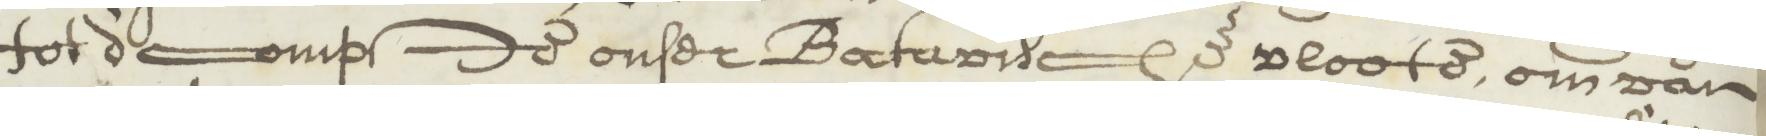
tot d’compste onser Batavische vloote, om van
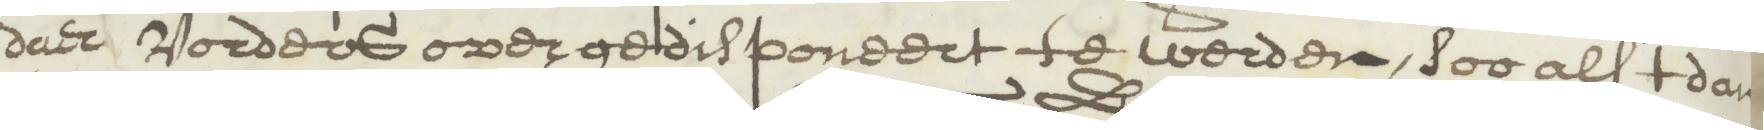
daer orders over gedisponeert te werden, soo als ’t da
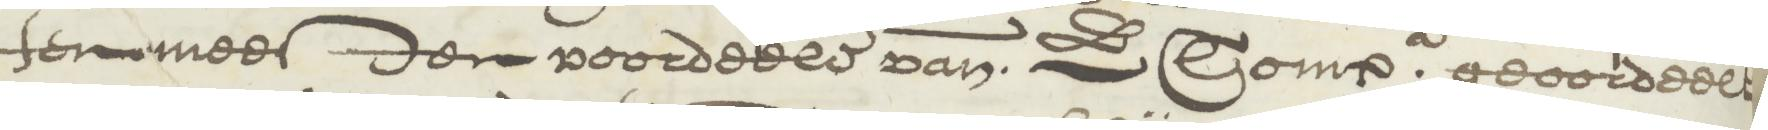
ten meesten voordeele van. S Comp.s geoordeelt
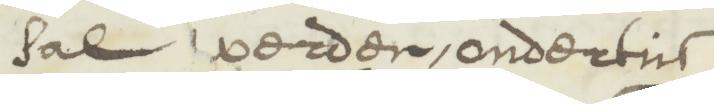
sal verder, ondertusschen beijvert ende behertic
